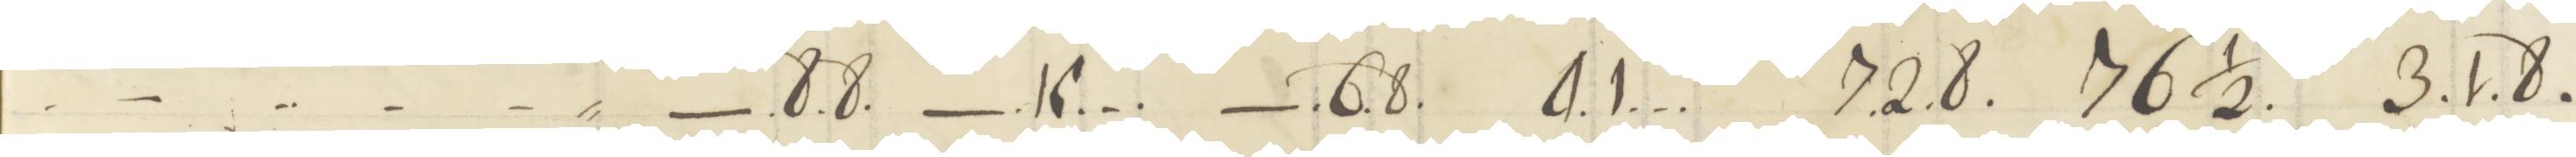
. - - - - „ —.8.8. —.15.-. —.6.8. 4.1.-. 7.2.8. 76½. 3.1.8
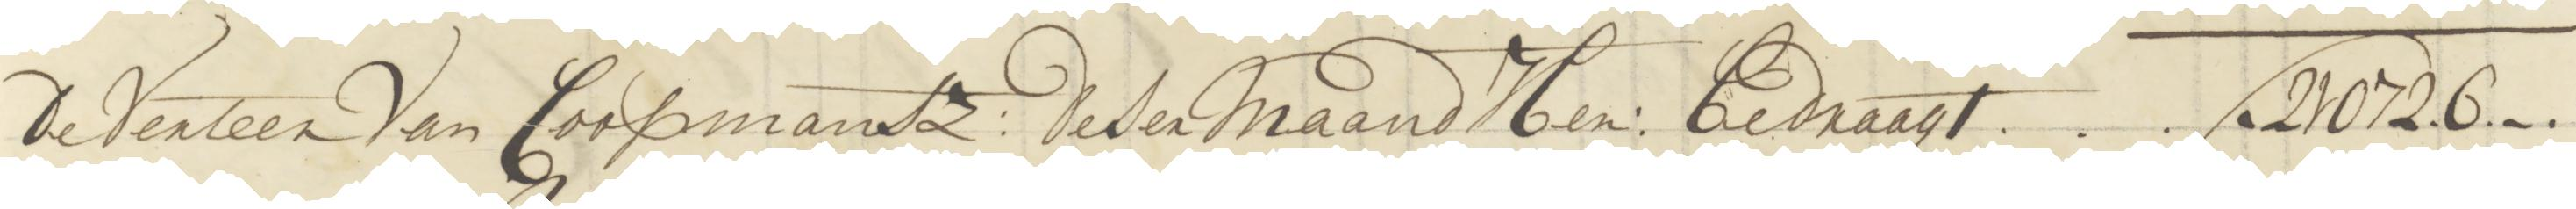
de Verteer Van Coopmansz: deser maand Her: bedraagt . . . ƒ21072.6.-.
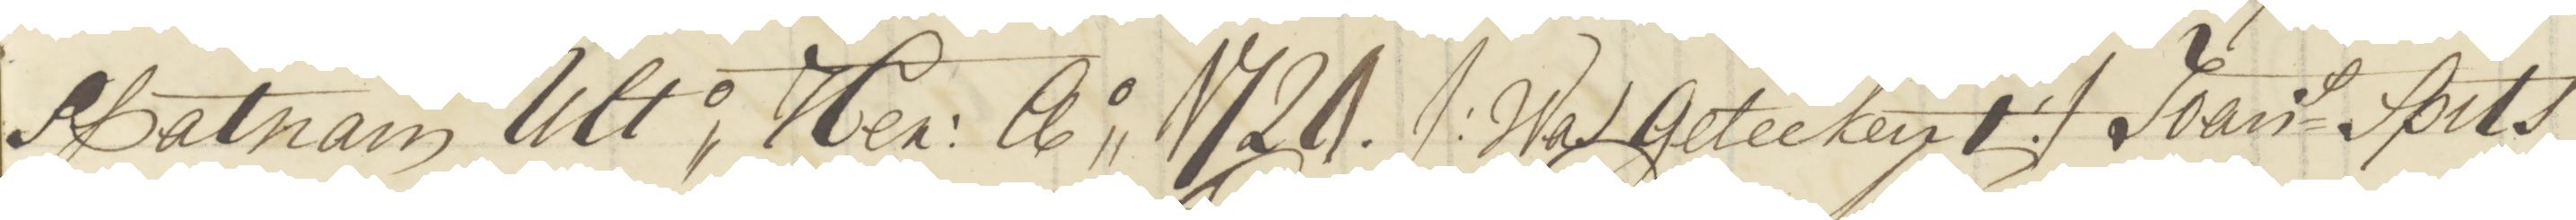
Spatnam Ult„o 7ber: A„o 1724. /:Was geteekent:/ Joan=s spits
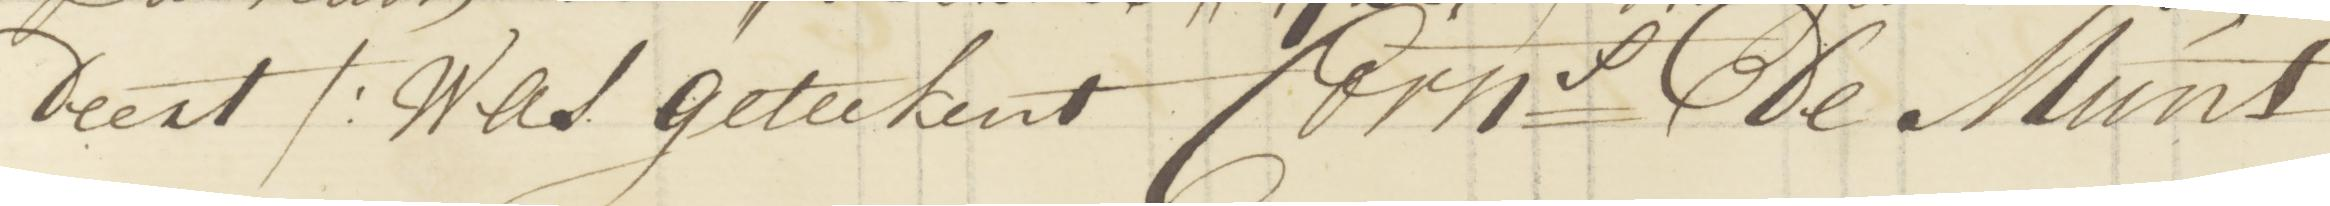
deert /:Was geteekent Corn=s de Munt
